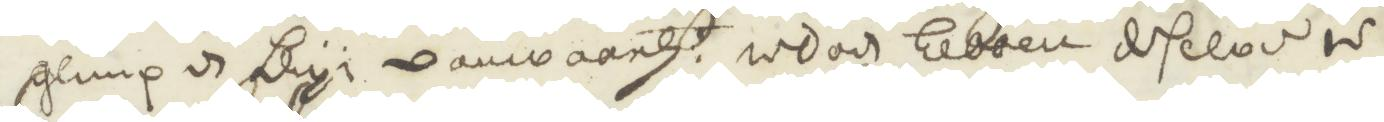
glimp en schijn vanwaarh:t tedoen hebben deselve te
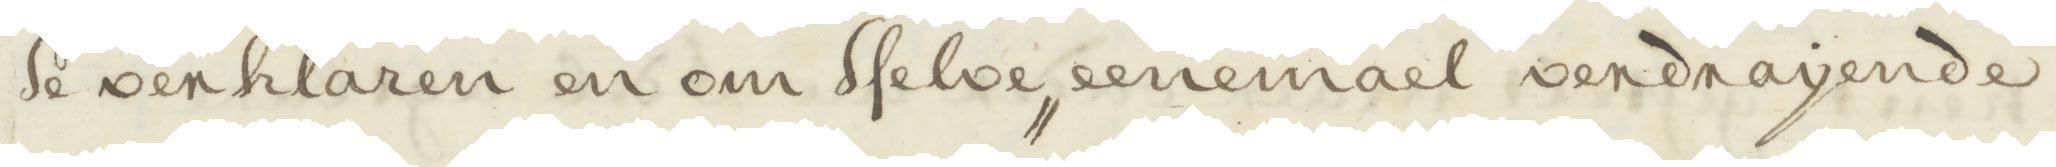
te verklaren en om tselve„ eenemael verdraijende
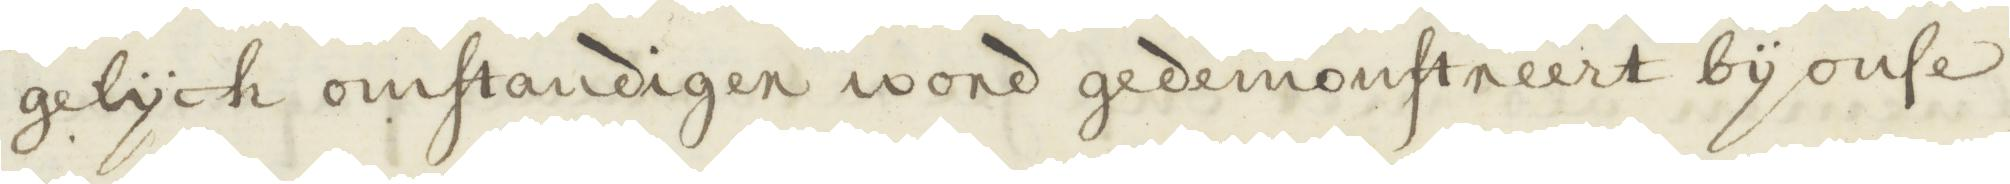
gelijck omstandiger word gedemonstreert bij onse
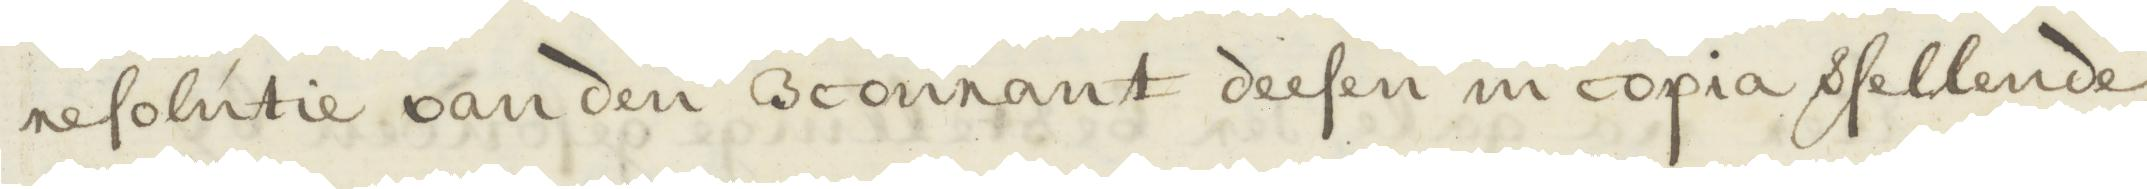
resolutie van den 3 courant deesen in copia versellende
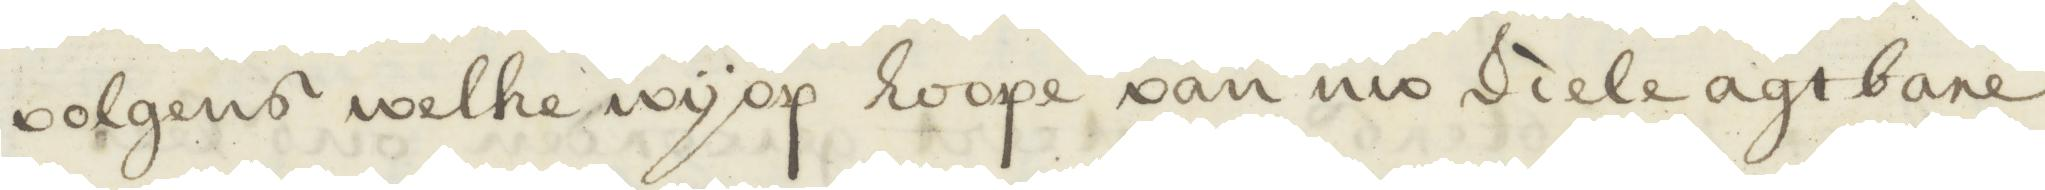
volgens welke wij op hoope van uw Edele agtbare
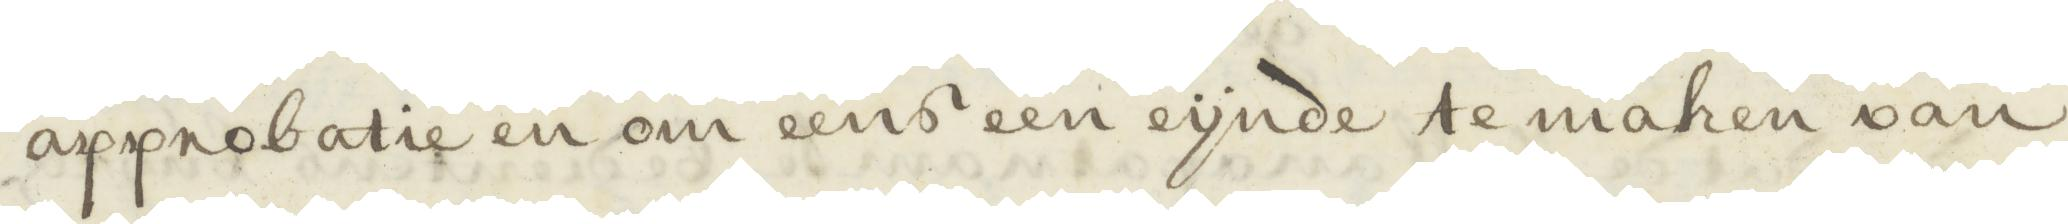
approbatie en om eens een eijnde te maken van
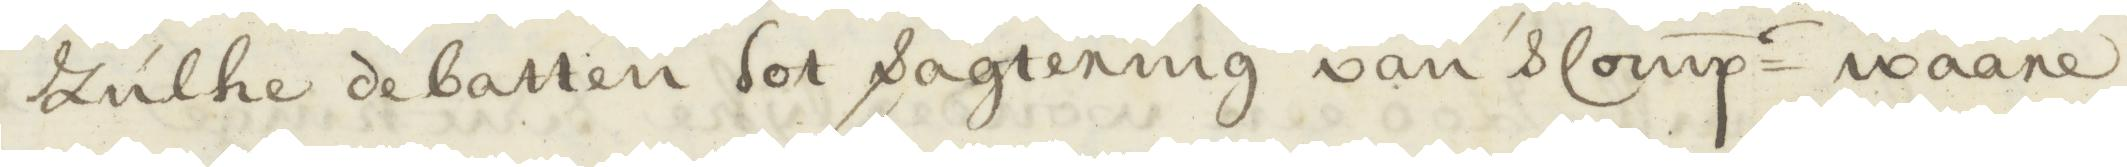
zulke de batten tot veragtering van ’s Comp=s waare
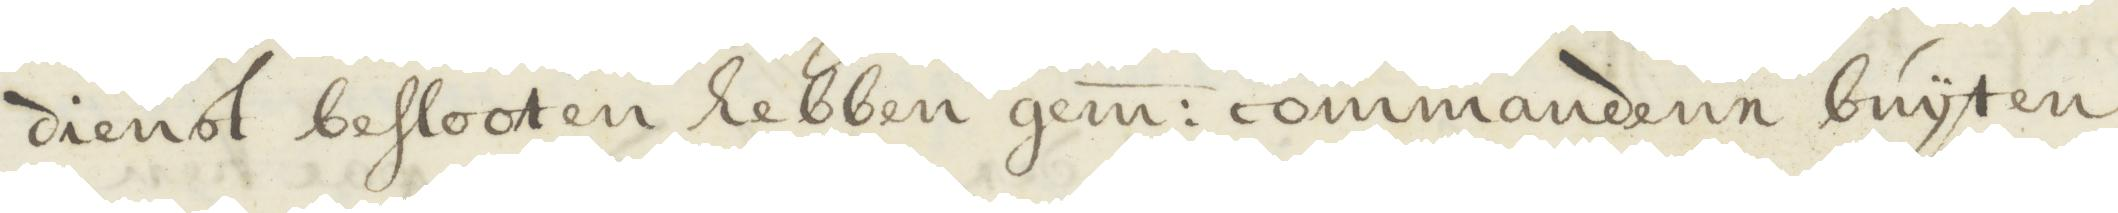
dienst beslooten hebben gem: commandeur buijten
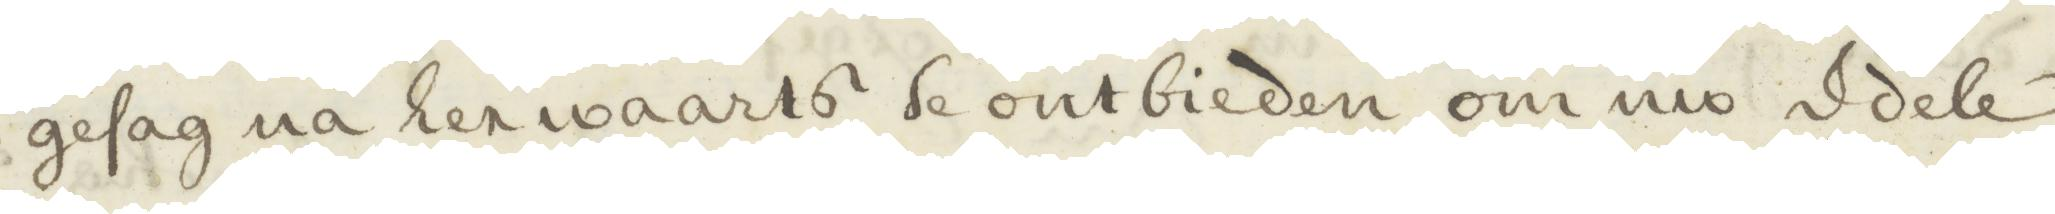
gesag na herwaarts te ontbieden, om uw Edele
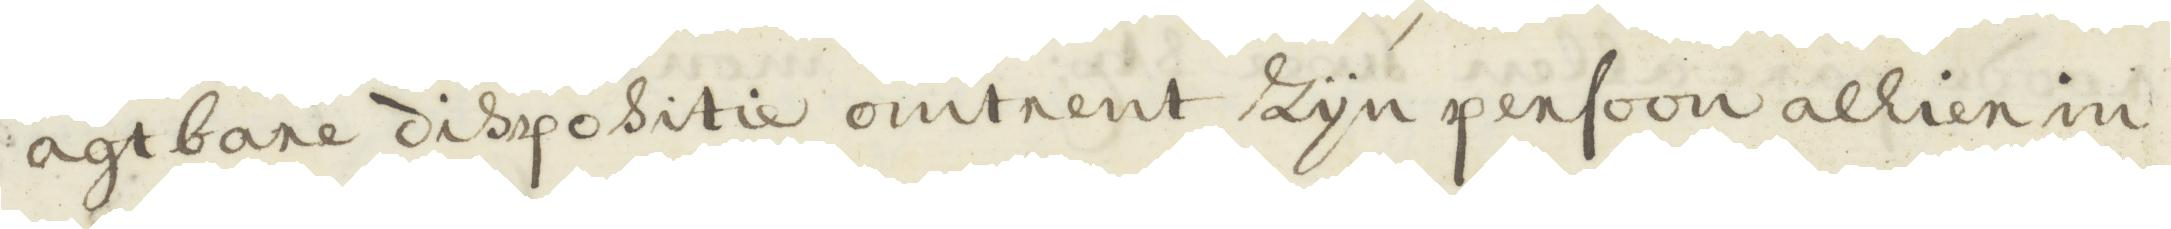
agtbare dispositie omtrent zijn persoon alhier in
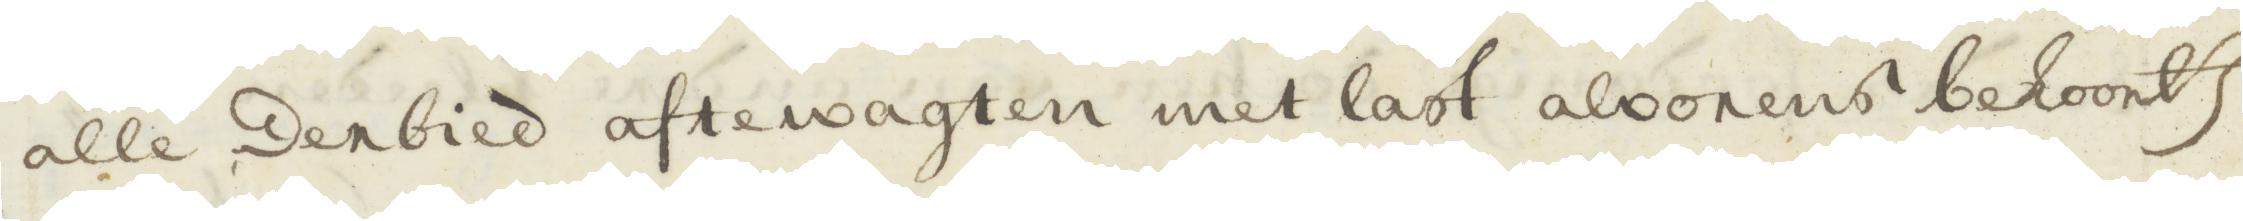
alle Eerbied aftewagten met last alvorens behoorlijk
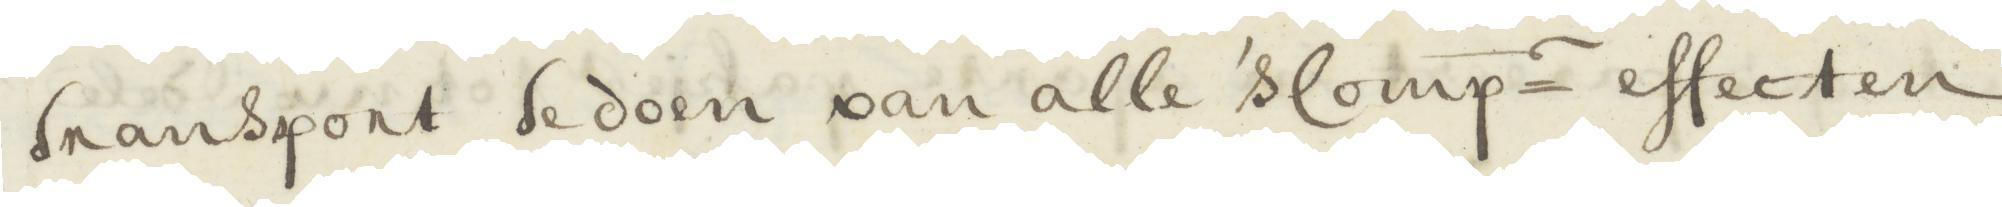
transport te doen van alle ’s Comp=s effecten
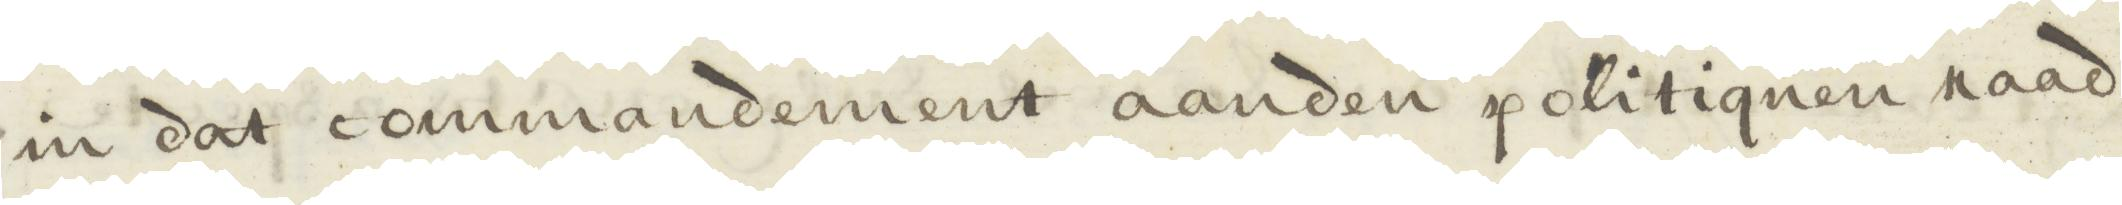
in dat commandement aan den politiquen raad
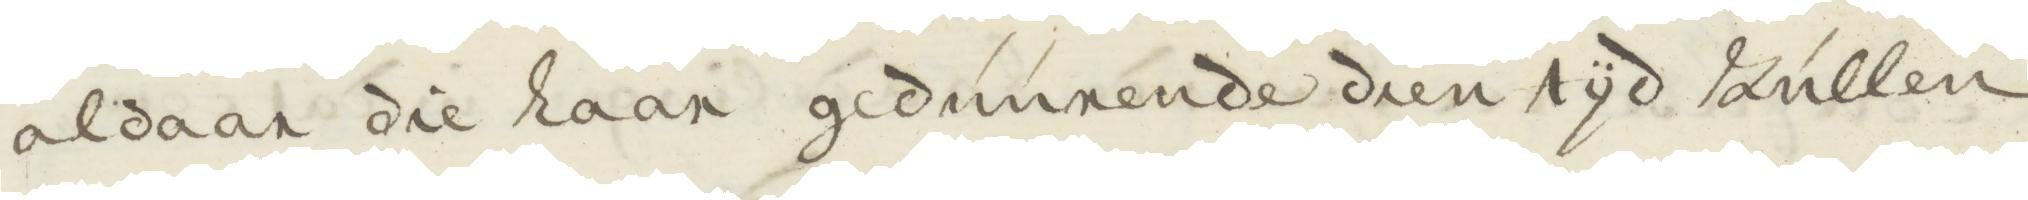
aldaar die haar geduurende dien tijd zullen
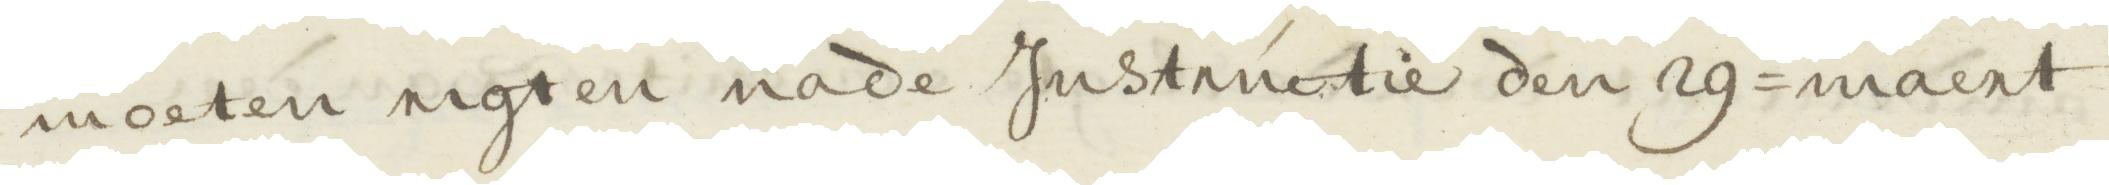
moeten rigten nade Jnstructie der 29=e maert
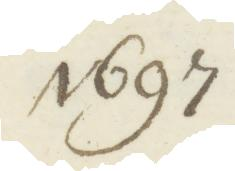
1697
